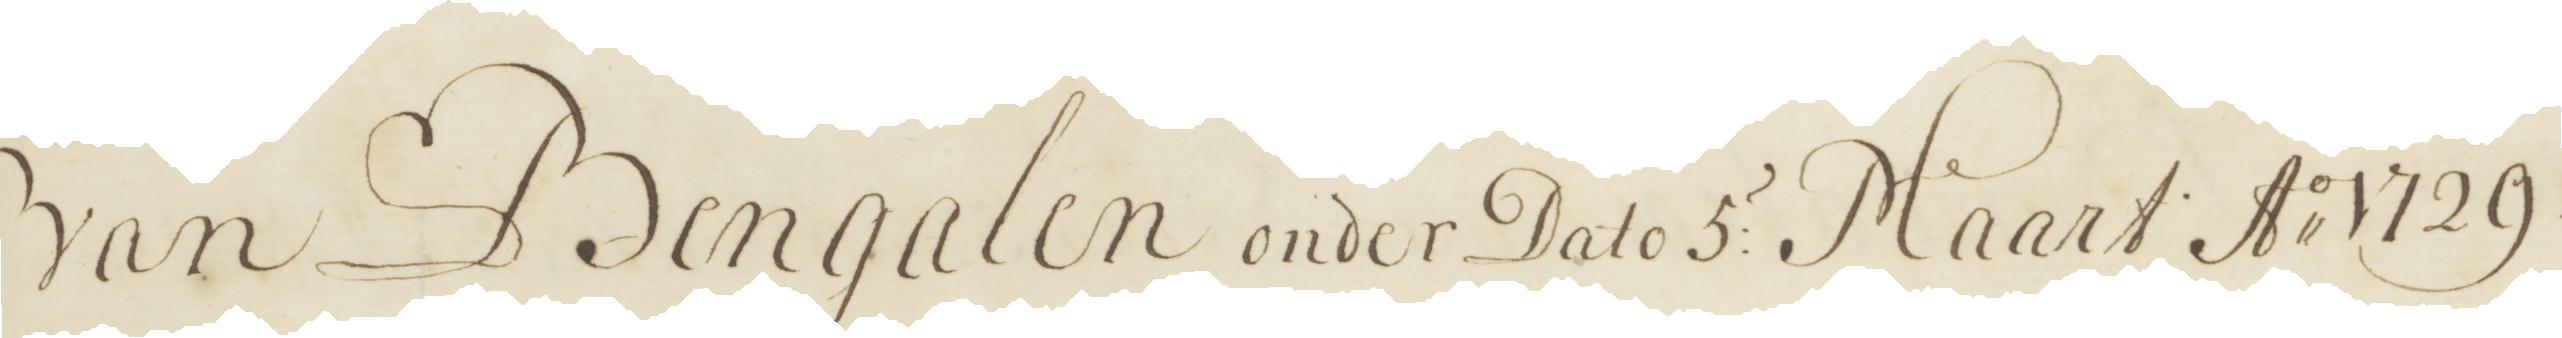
Van Bengalen onder Dato 5:' Maart A„o 1729
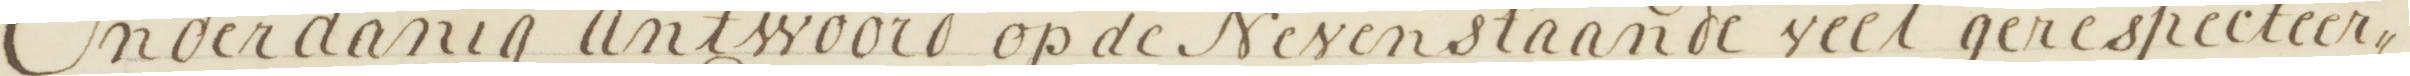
Onderdanig antwoord op de Nevenstaande veel gerespecteer„
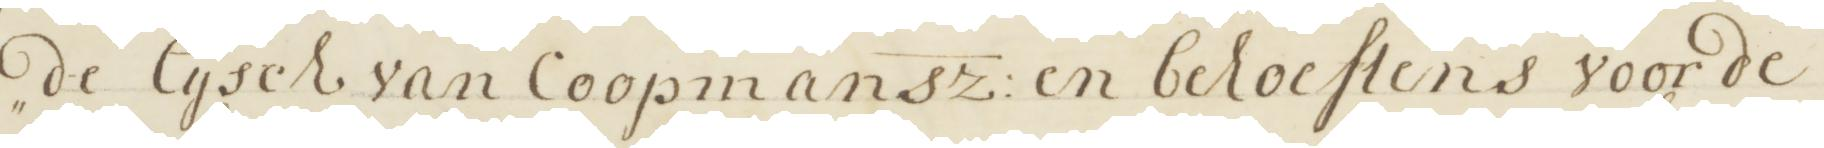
„de Eysch van Coopmansz: en behoeftens voor de
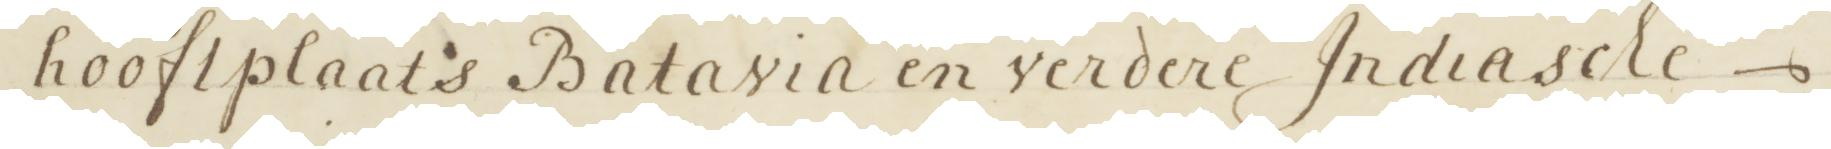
hooftplaats Batavia en verdere Jndiasche —
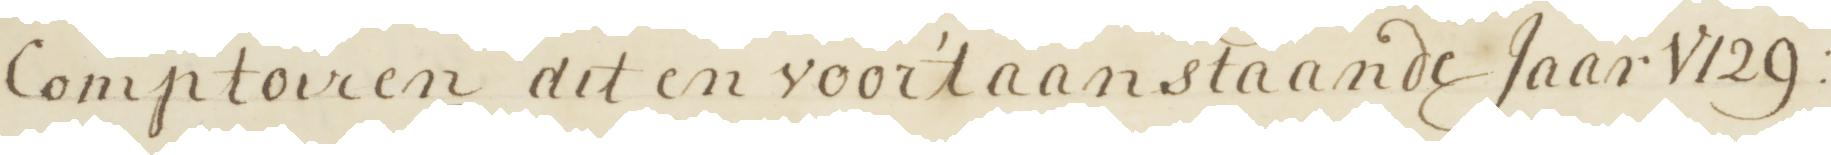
Comptoiren dit en voor 't aanstaande Jaar 1729
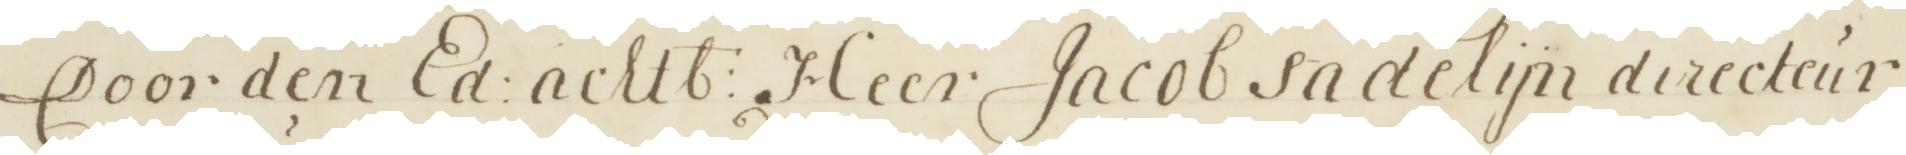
Door den Ed: achtb: Heer Jacob sadelijn directeur
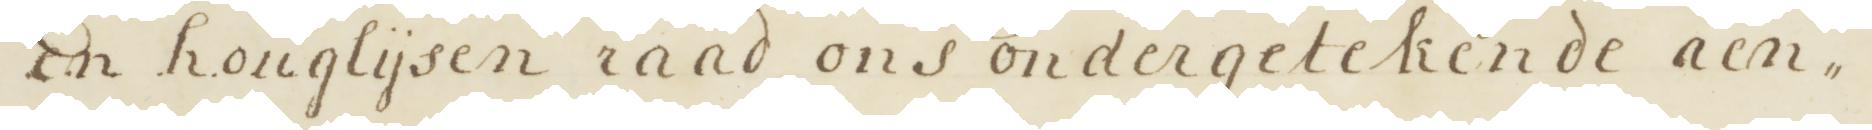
en houglijsen raad ons ondergetekende aen„
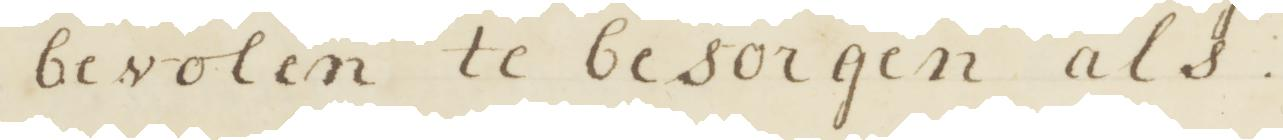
bevolen te besorgen als
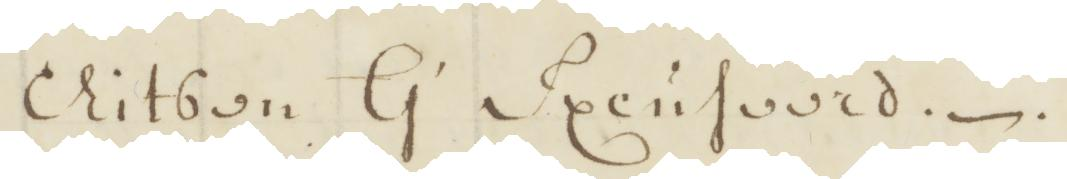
Chitsen G’ Excuseerd. — .
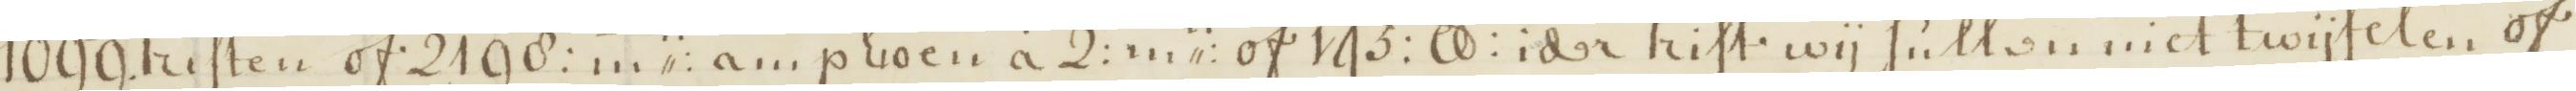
1099 kisten of 2198: m„n : amphioen á 2: m„n of 145: lb:e ider kist wij sullen niet twijfelen of
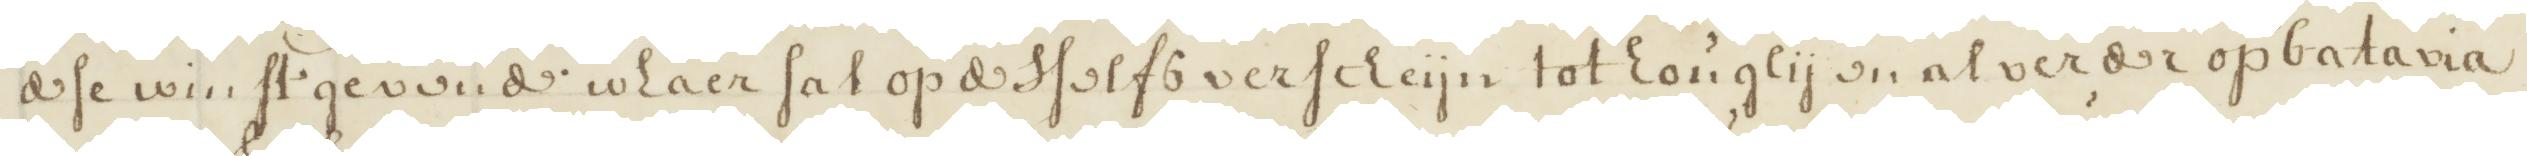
dese winst gevende whaer sal op desselfs verscheijn tot houglij en al verder op batavia
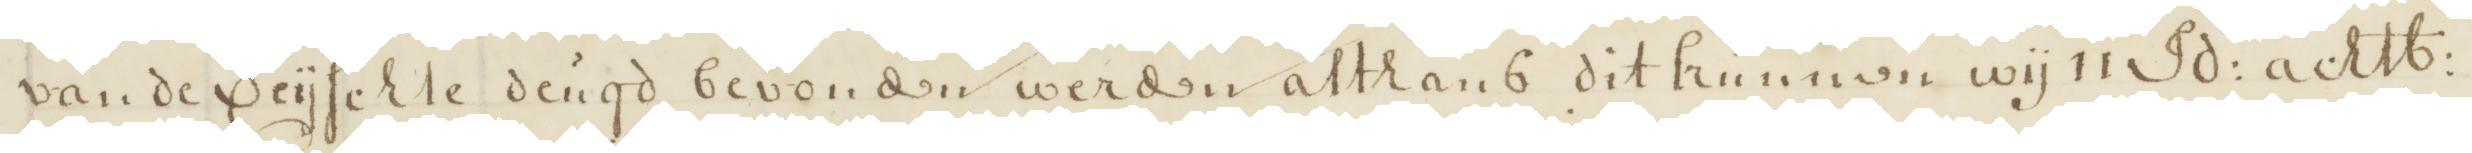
van de vereijschte deugd bevonden werden althans dit kunnen wij uEd: achtb:
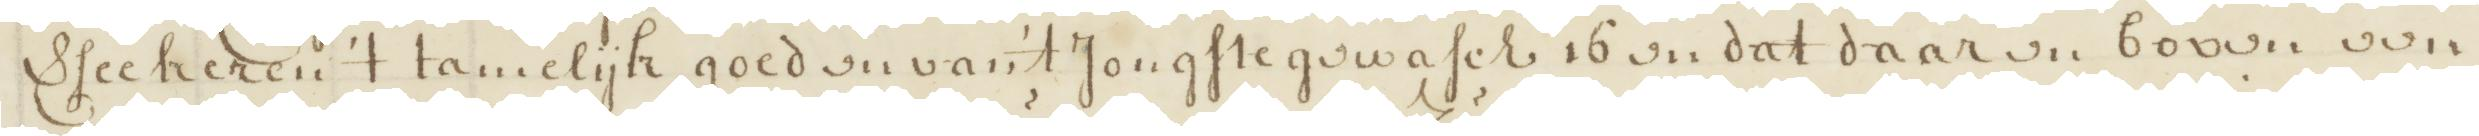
verseekeren ’t tamelijk goed en van 't Jongste gewasch is en dat daar en boven een
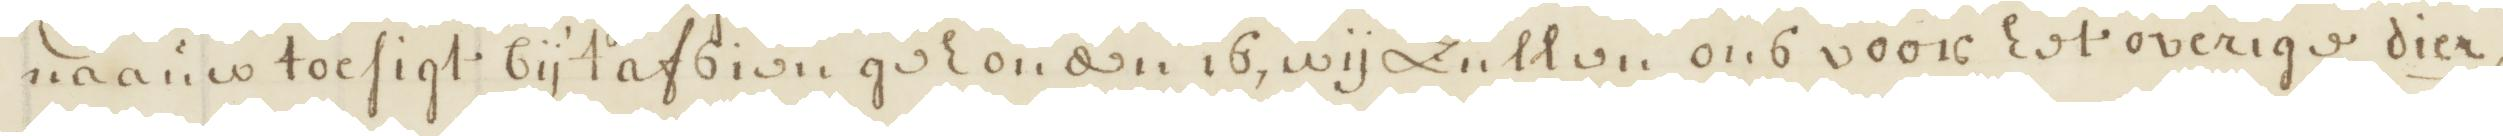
naauw toesigt bij 't afsien gehouden is, wij zullen ons voor het overige dier
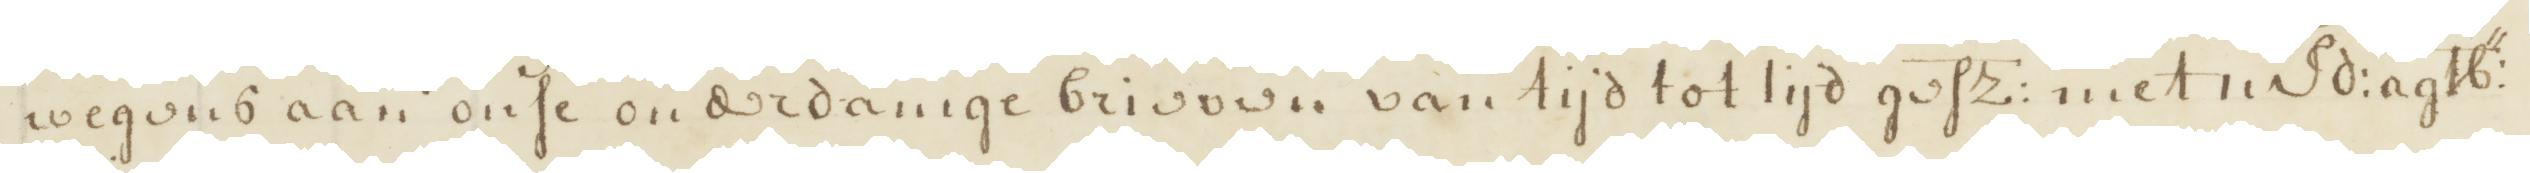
wegens aan onse onderdanige brieven van tijd tot tijd gesz: met u Ed: agtb:
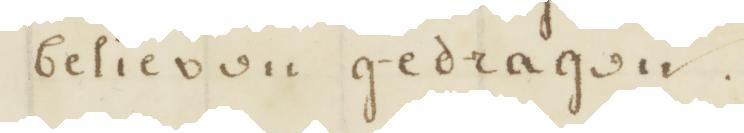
believen gedragen
